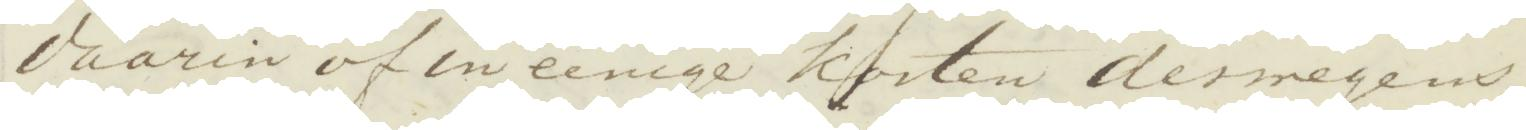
daarin of in eenige kosten deswegens
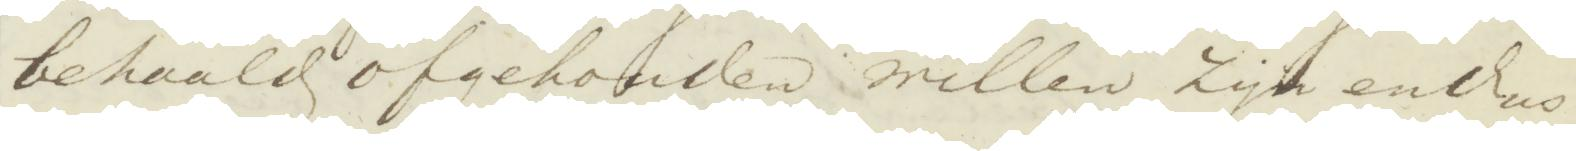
behaald of gehouden willen zijn en dus
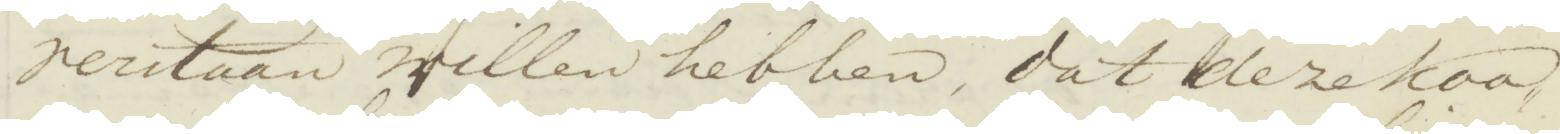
verstaan willen hebben, dat deze koo
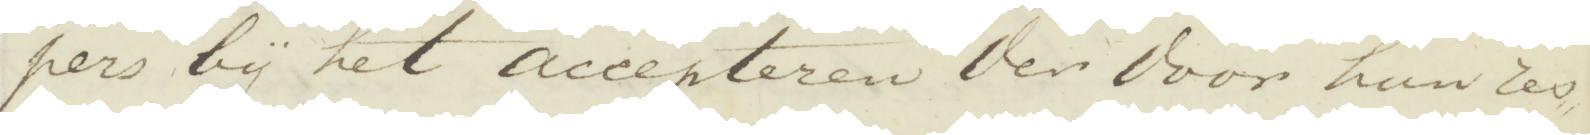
pers bij het accepteren der door hun res„
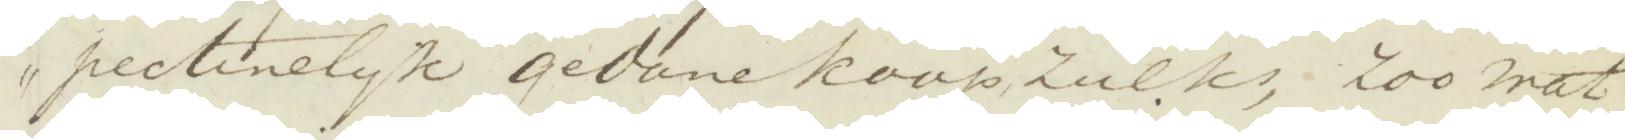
„pectivelijk gedane koop zulks, zoo wat
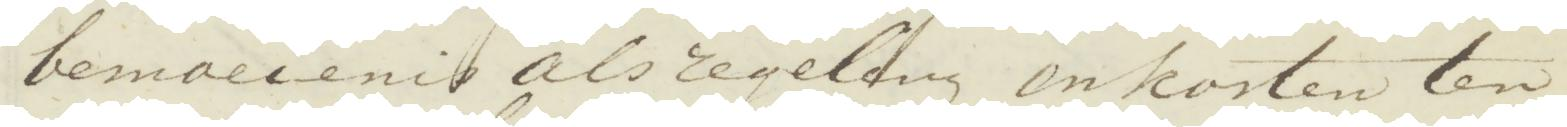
bemoeienis als regeling en kosten ten
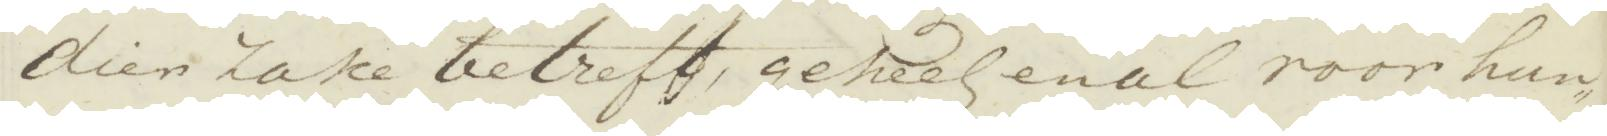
dier zake betreft, geheel en al voor hun„
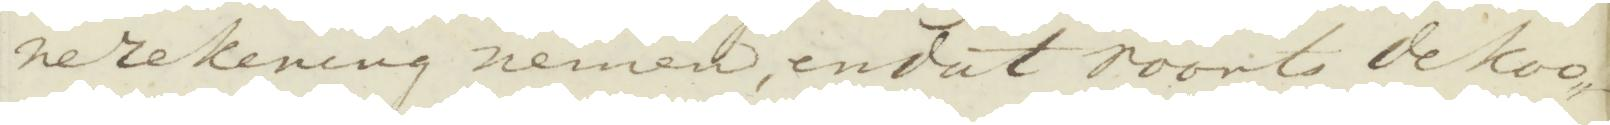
ne rekening nemen, en dat voorts de koo„
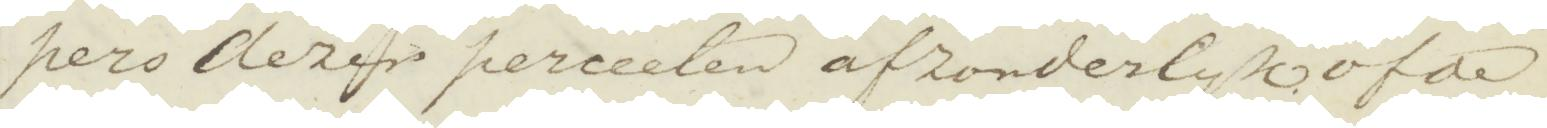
pers dezer perceelen afzonderlijk of de
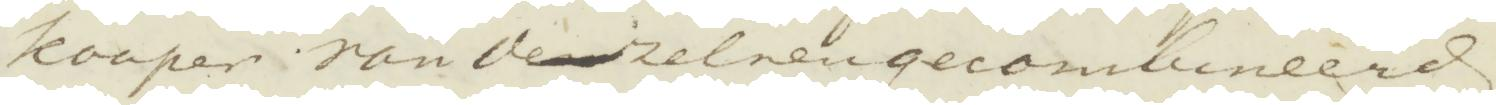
kooper van de zelven gecombineerd
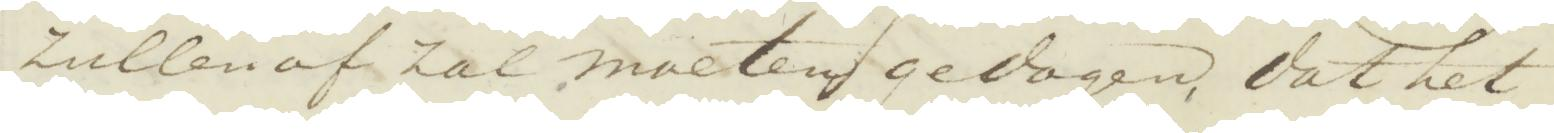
zullen of zal moeten gedogen, dat het
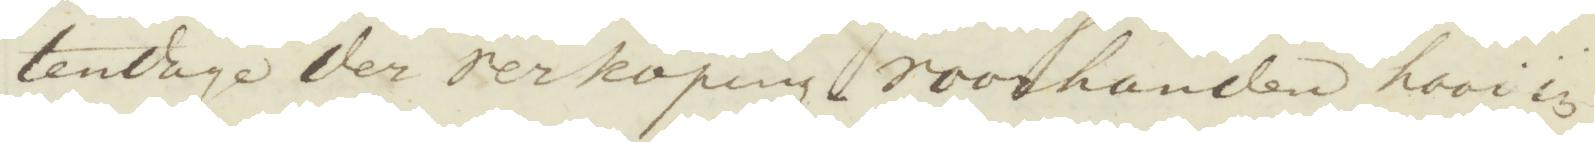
ten dage der verkoping voorhanden hooi in
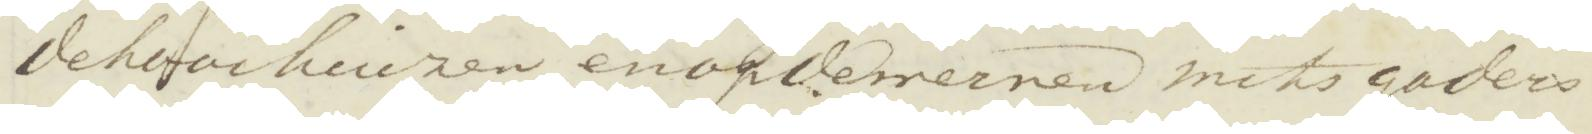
de hooihuizen en op de werven mitsgaders
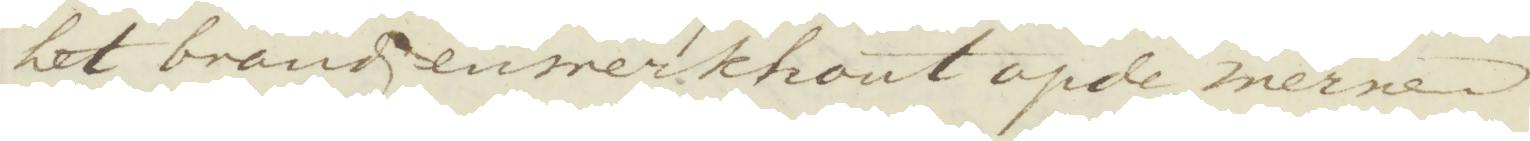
het brand en werkhout op de werven
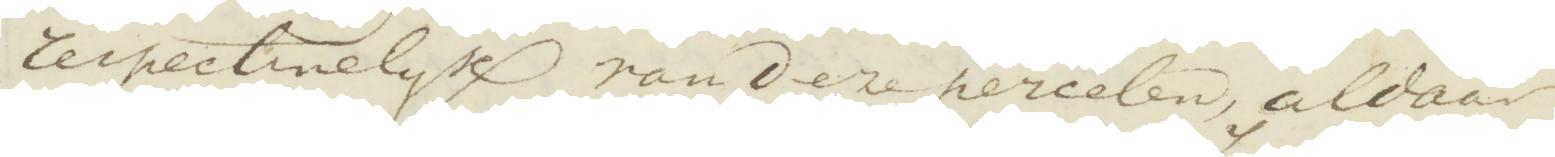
respectivelyk van deze percelen, aldaar
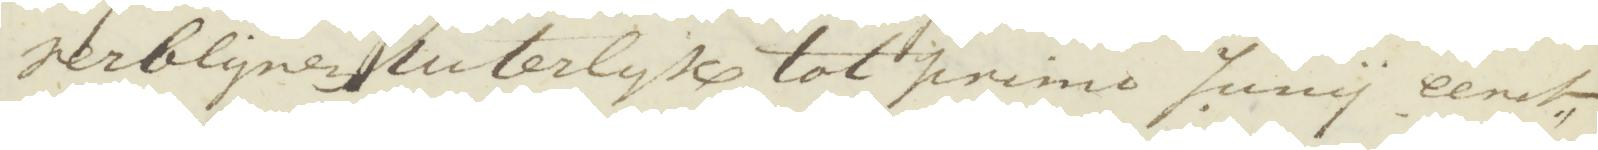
verblijven uiterlyk tot primo Junij eerst„
